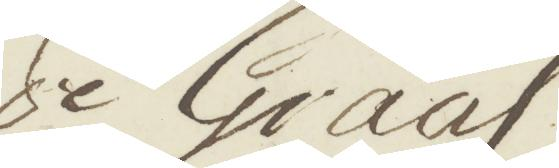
Coort de Graaf
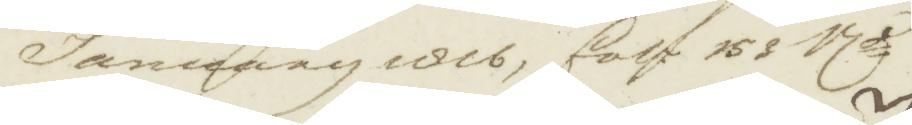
January 1816, folio 158 V=o
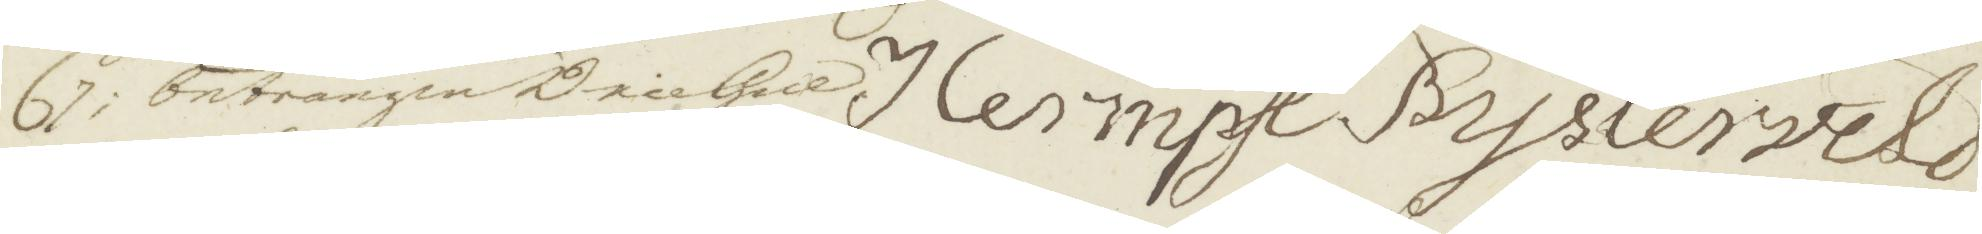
67; Ontvangen Drie Gul Hermpje Bysterveld
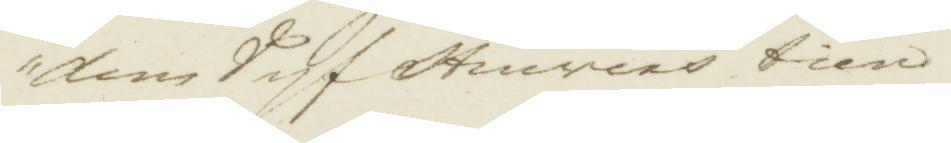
„dens Vyf stuivers tien
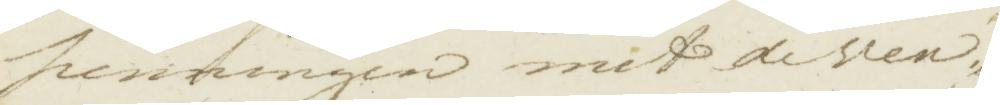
penningen met de ver„
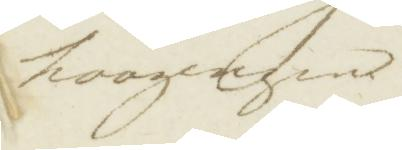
hoogingen
